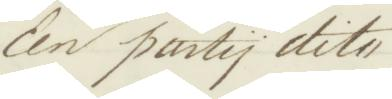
Een partij dito
